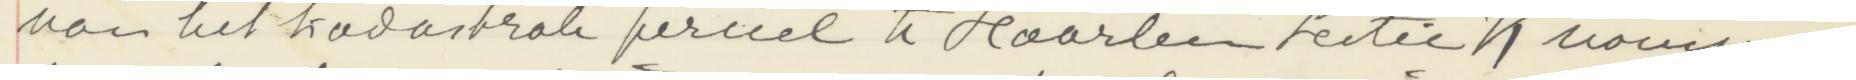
van het kadastrale perceel te Haarlem Sectie K nommer
